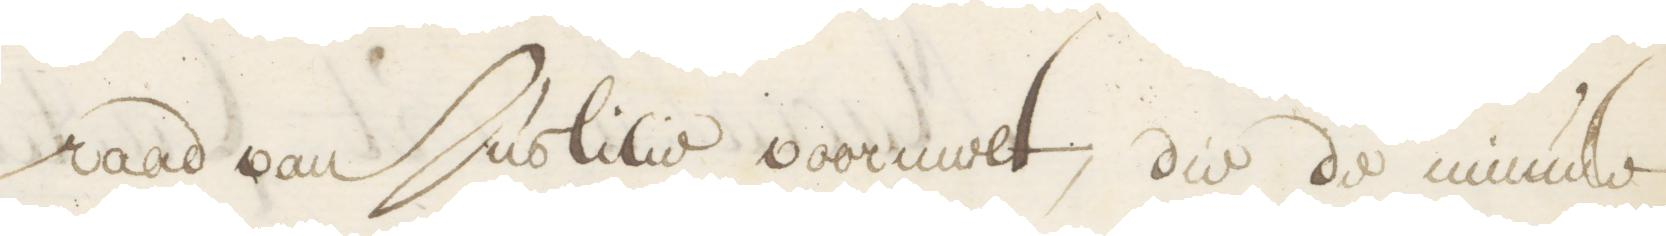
raad van Justitie voormelt, die de minute
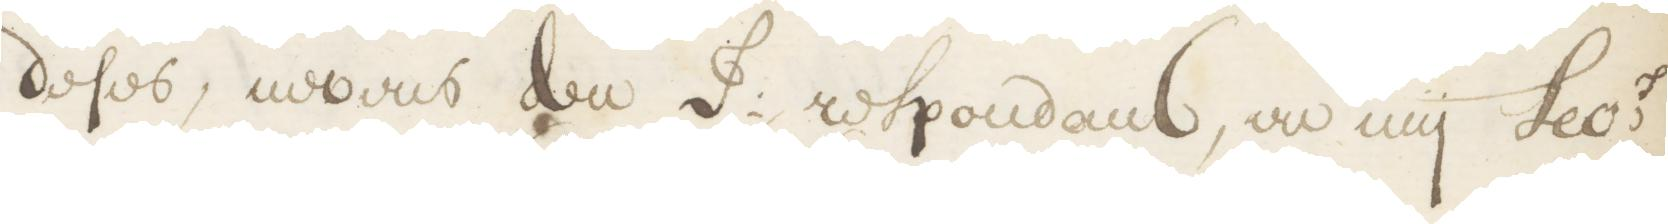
deses, nevens den E: respondant, en mij sec:s
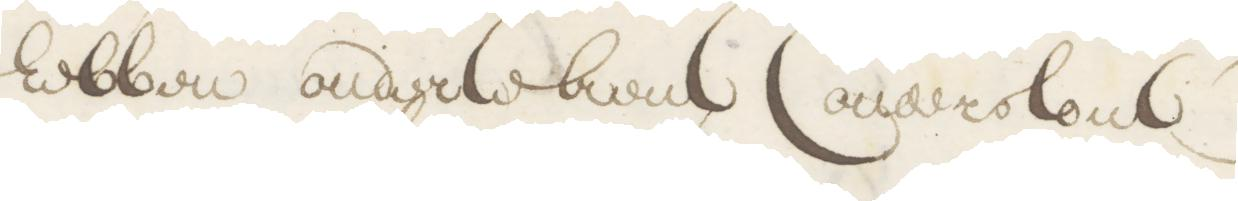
hebben ondertekent (onderstont
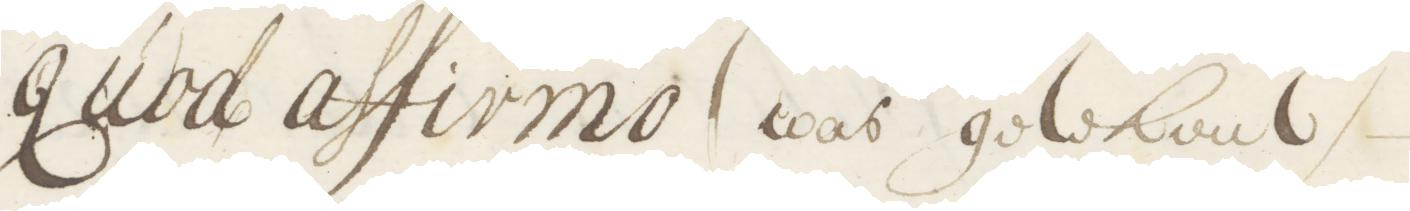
Quod affirmo was getekent
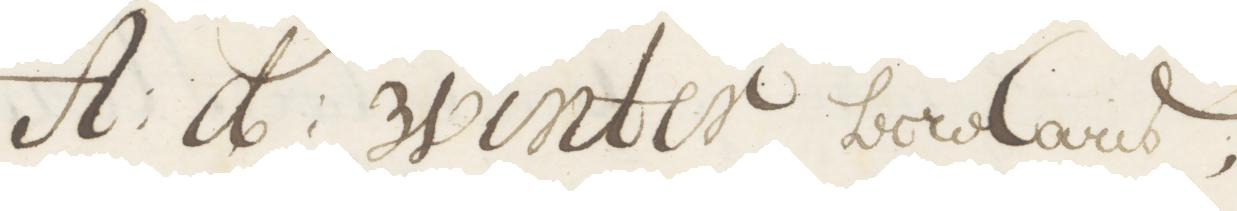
A: d: Winter secretaris,
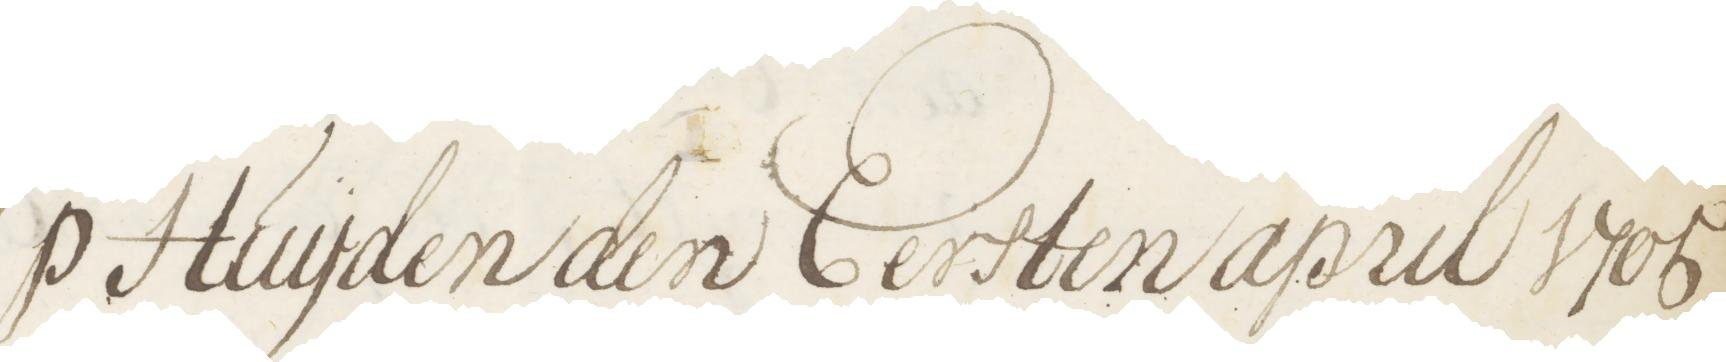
Op Huijden den Eersten april 1705
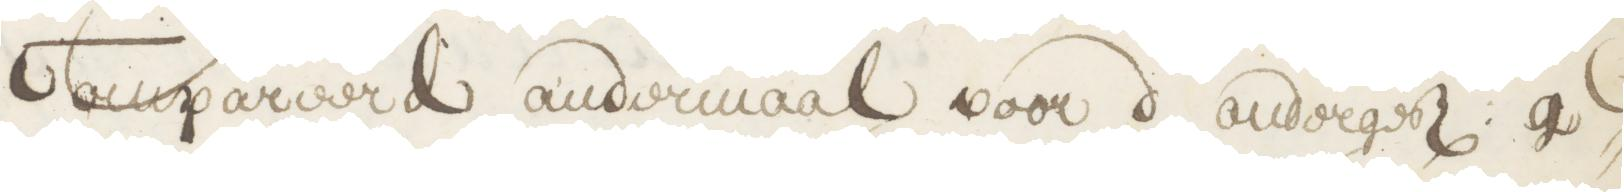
Compareerde andermaal voor d ondergesz: ge„
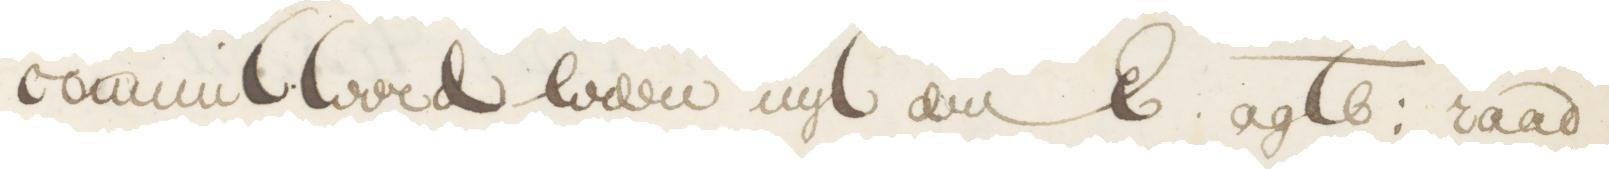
committeerde leden uijt den E: agtb: raad
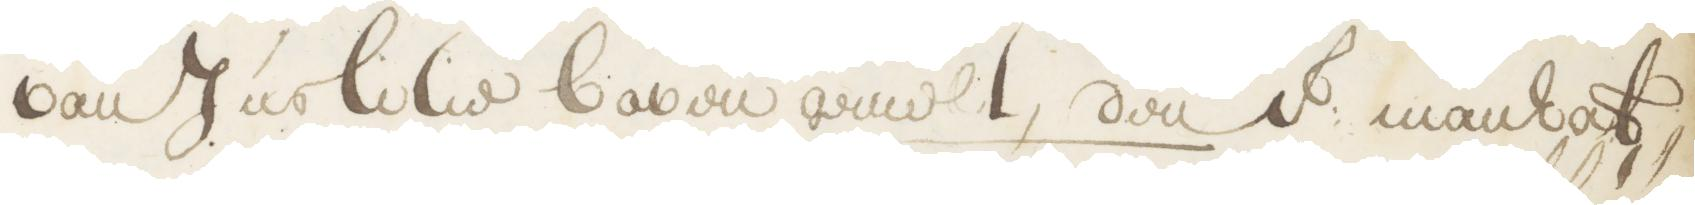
van Justitie boven gemelt, den E: manhaf
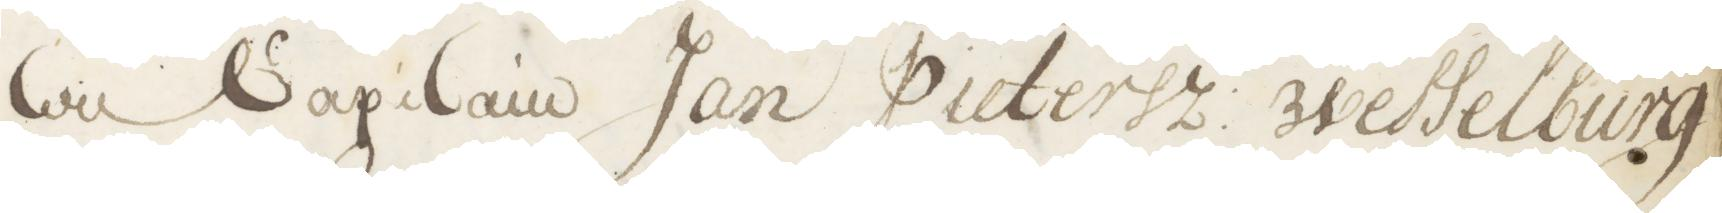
ten Capitain Jan Pietersz: Wesselburg
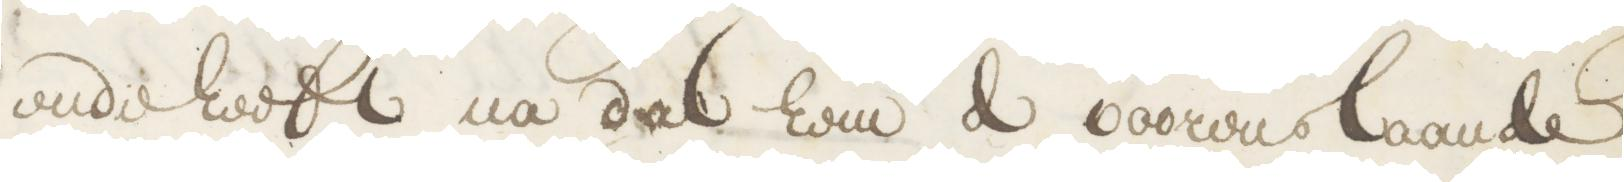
ende heeft na dat hem de voorenstaande
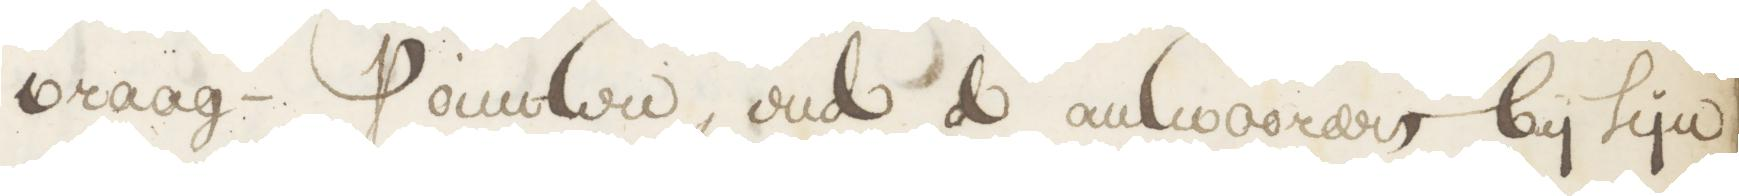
vraag- Pointen, ende de antwoorden bij sijn
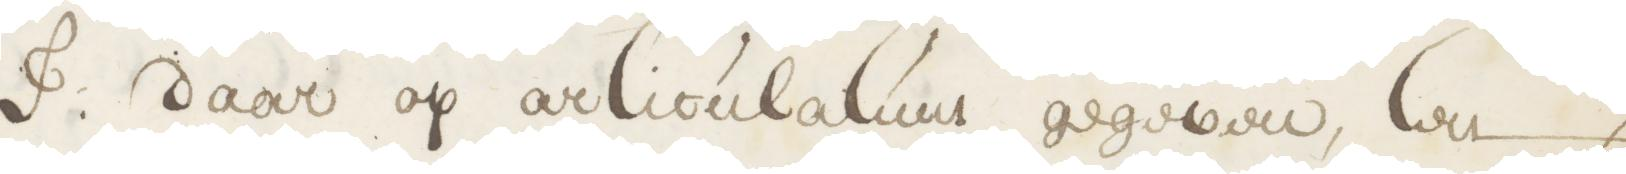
E: daar op articulatum gegeven, ten
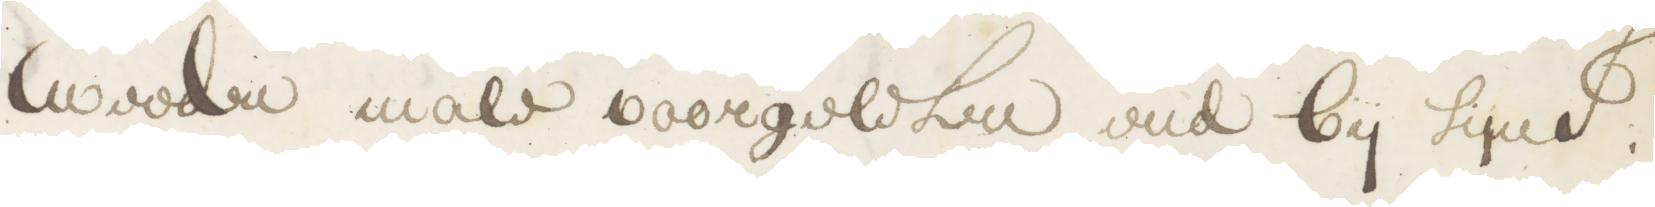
tweeden male voorgelesen ende bij sijn E:
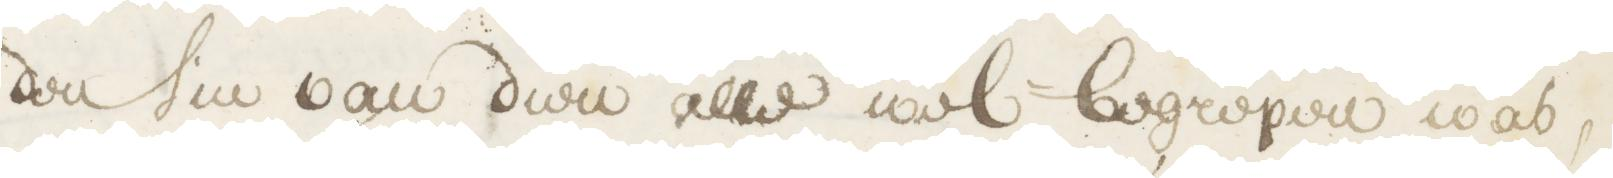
den sin van dien alle wel begrepen was
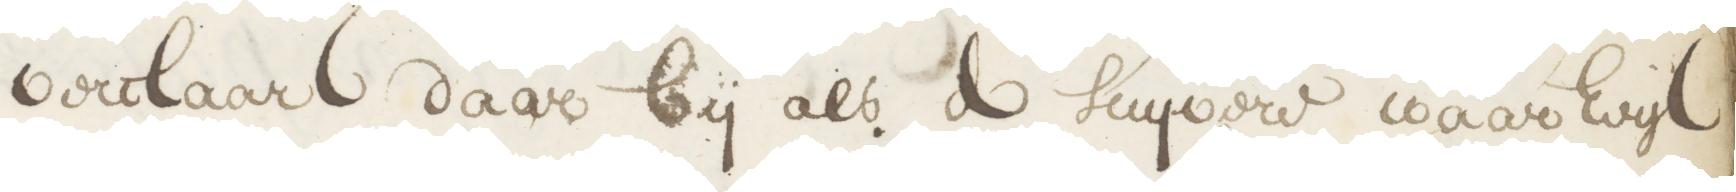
verclaart daar bij als de suijvere waarheijt
